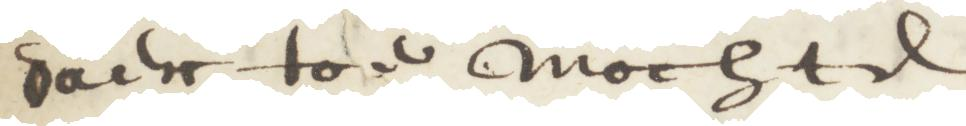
daer toe mochte
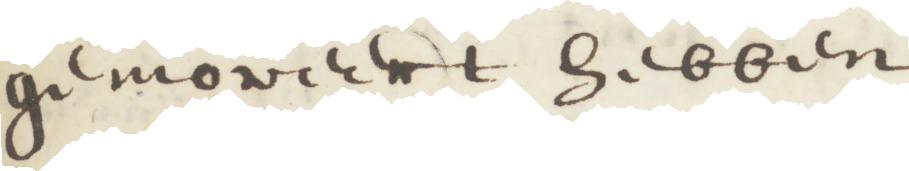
gemoveert hebben
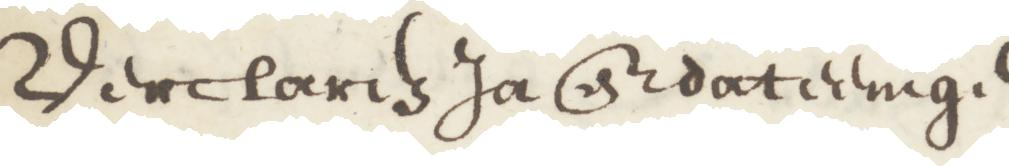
Verclaren Ja ende dat eenige
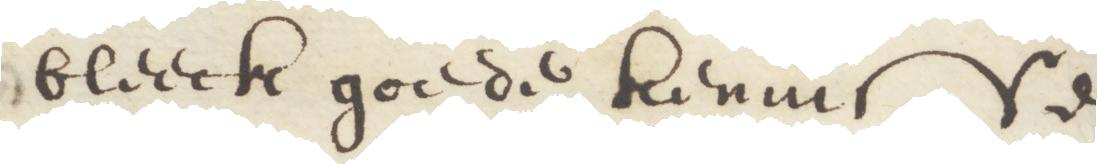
bleeck goede kennisse
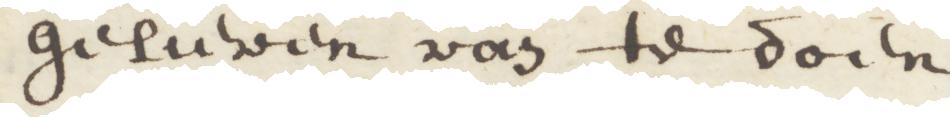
gelieven van te doen
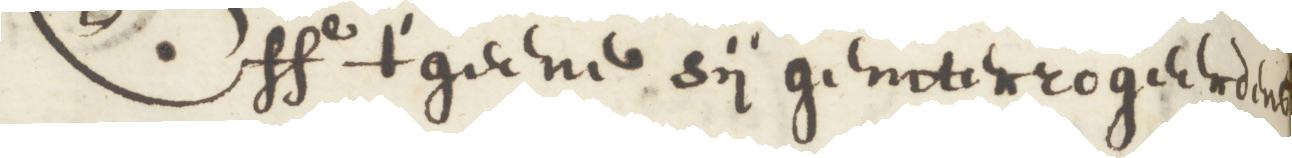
Offe t'geene sij geinterrogeerdens
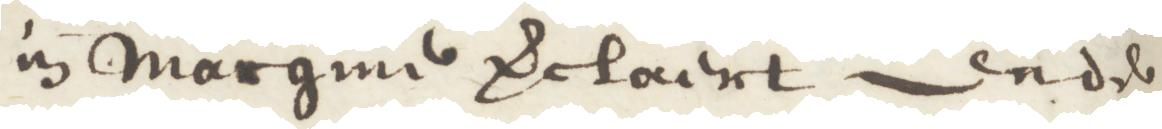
in margine verclaert ende
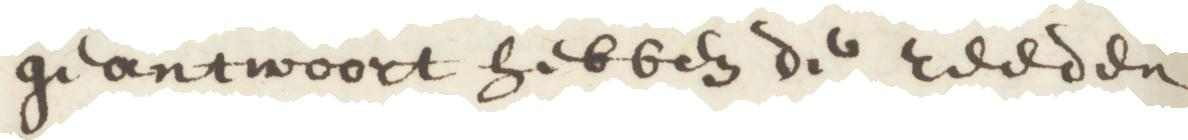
geantwoort hebben de reeden
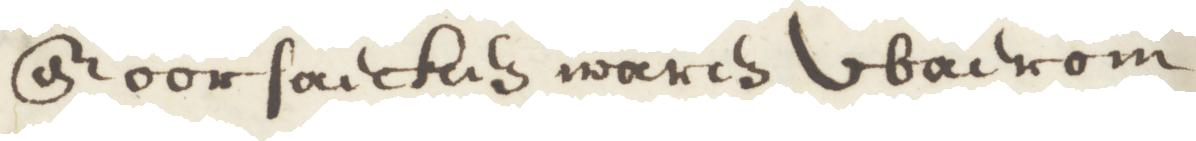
ende oorsaecken waren waerom
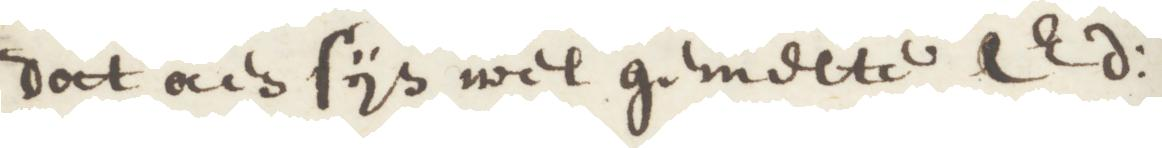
dat aen sijn wel gemelte Ed:
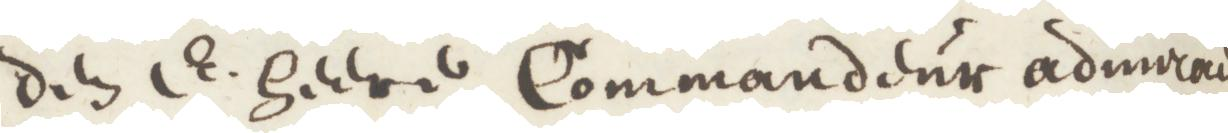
den E. heere Commandeur admirael
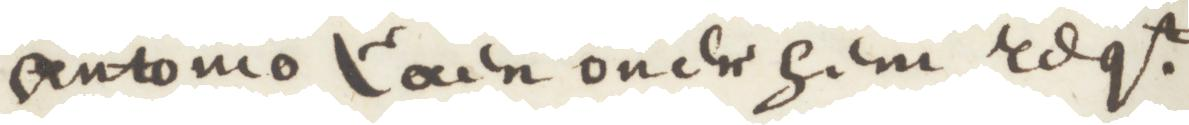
antoino Caen ouer hem req.t
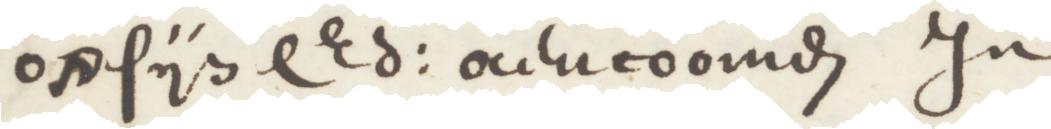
op sijn Ed: aencoomen Jn
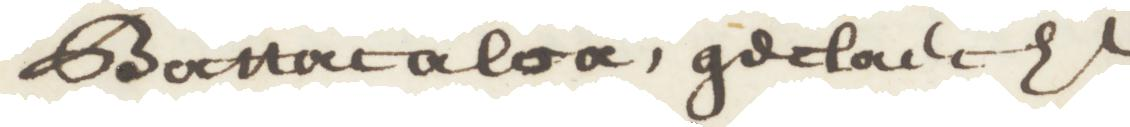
Battacaloa, geclaecht
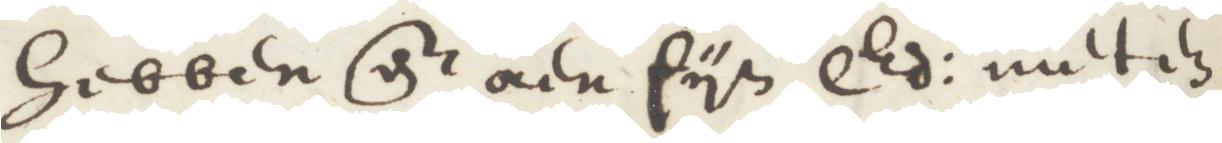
hebben ende aen sijn Ed: niet en
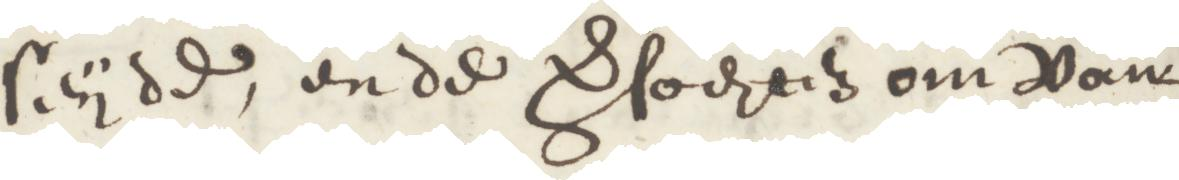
seijde, ende versochten om van
